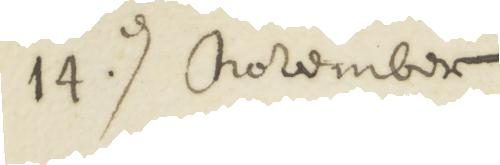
14.en November
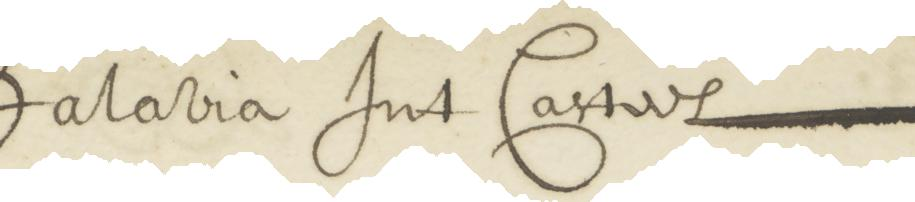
atavia Jnt Casteel
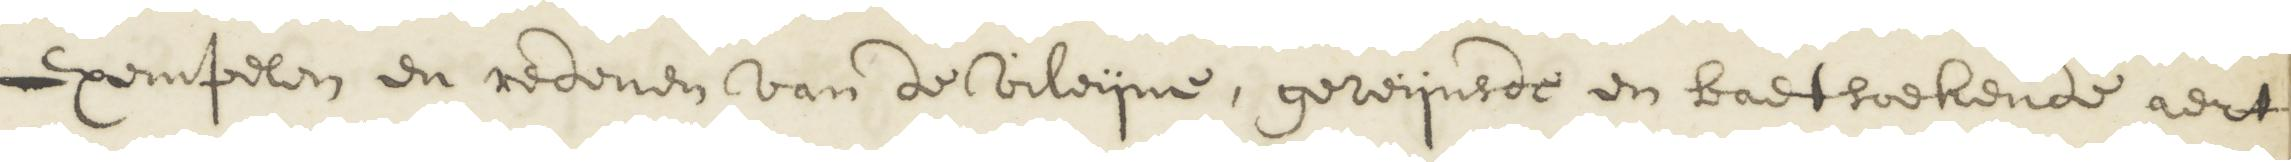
Exempelen en redenen van de vileijne, geveijnsde en baetsoekende aert
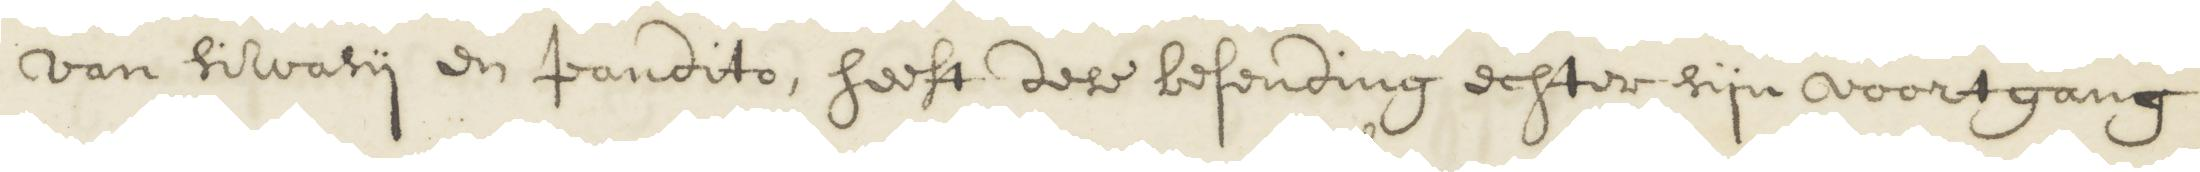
van siwasij en pandito, heeft dese besending echter sijn voortgang
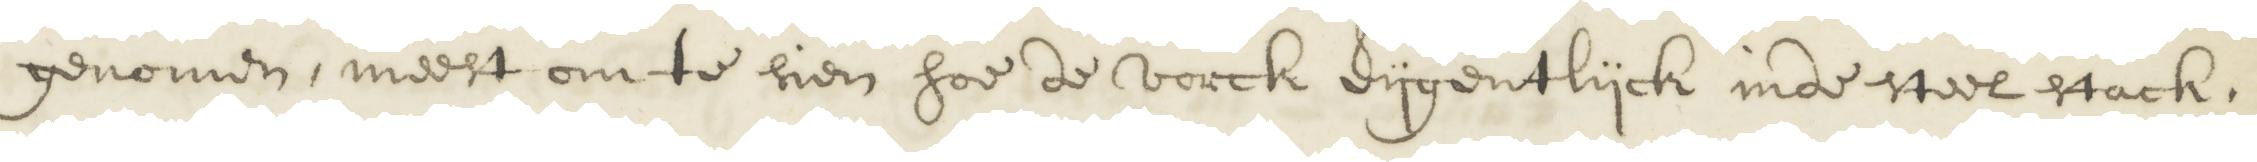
genomen, meest om te sien hoe de vorck Eijgentlijck inde steel stack.
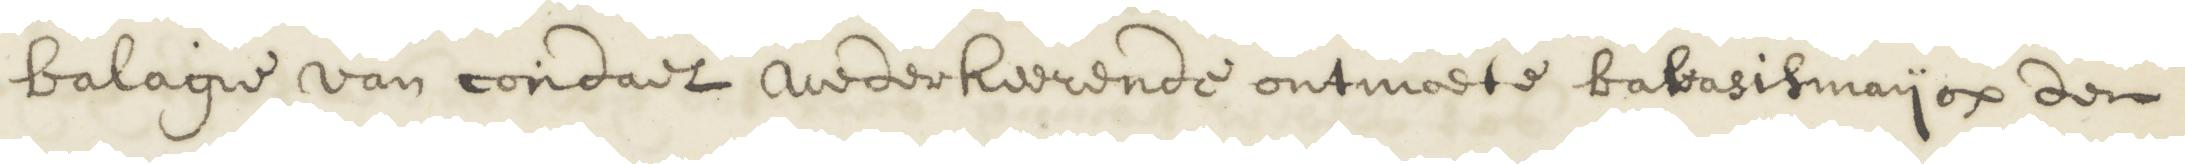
balagie van condael wederkeerende ontmoete babasismaij op den
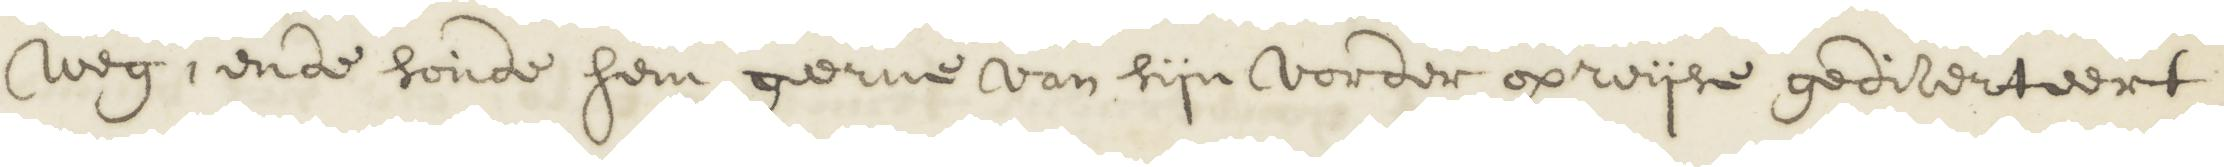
weg, ende soude hem gerne van sijn vorder opreijse gediverteert
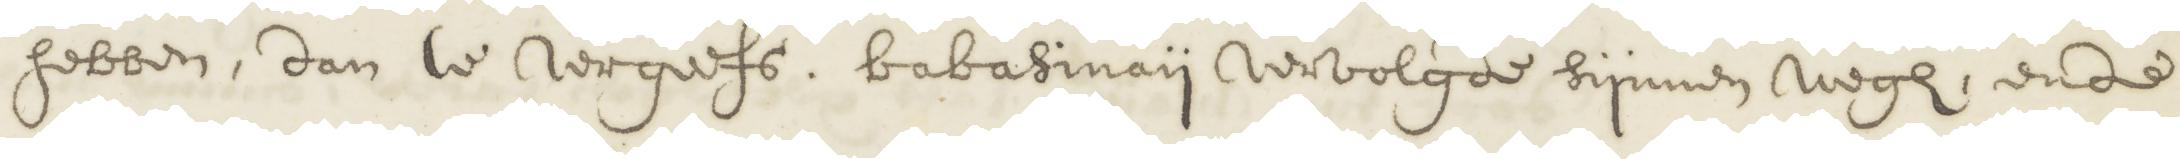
hebben, dan te vergeefs. babasinaij vervolgde sijnnen wegh, ende
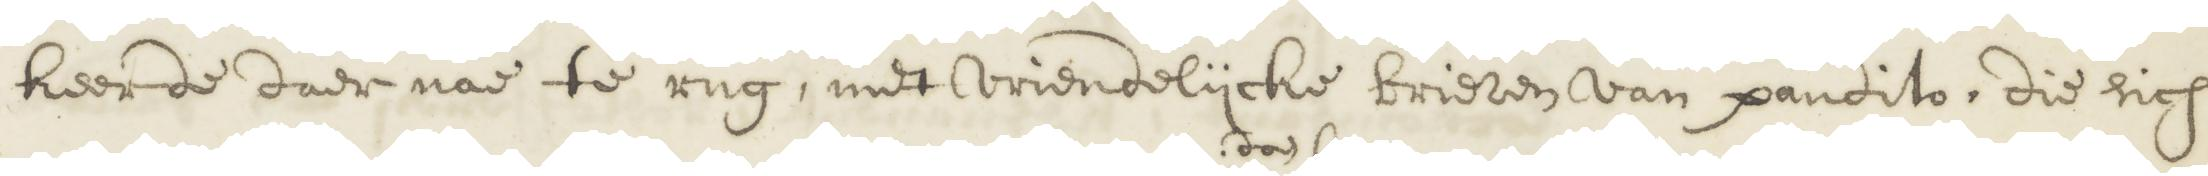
keerde daer nae te rug, met vriendelijcke brieven van pandito, die sich
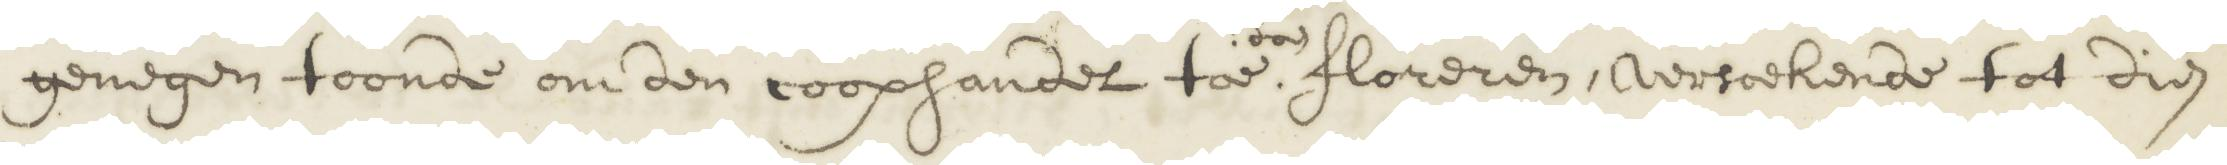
genegen toonde om den coophandel toe doen floreren, versoekende tot dien
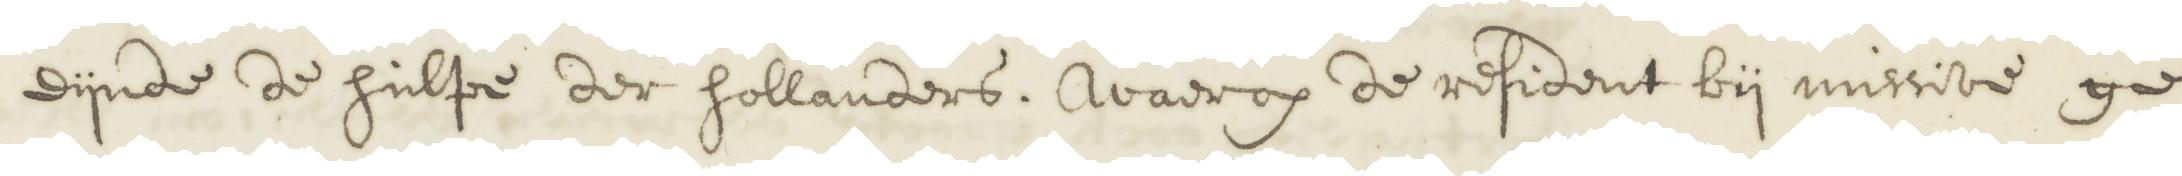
eijnde de hulpe der hollanders. waerop de resident bij missive ge
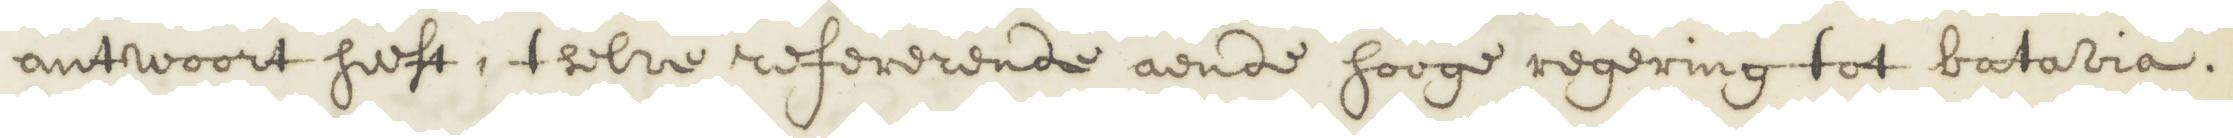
antwoort heeft, tselve refererende aende hooge regering tot batavia.
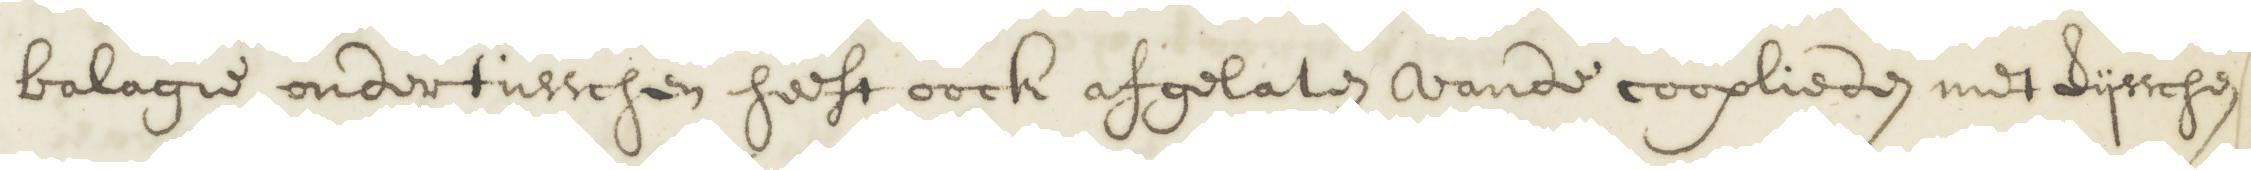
balagie ondertusschen heeft oock afgelaten vande cooplieden met Eijsschen
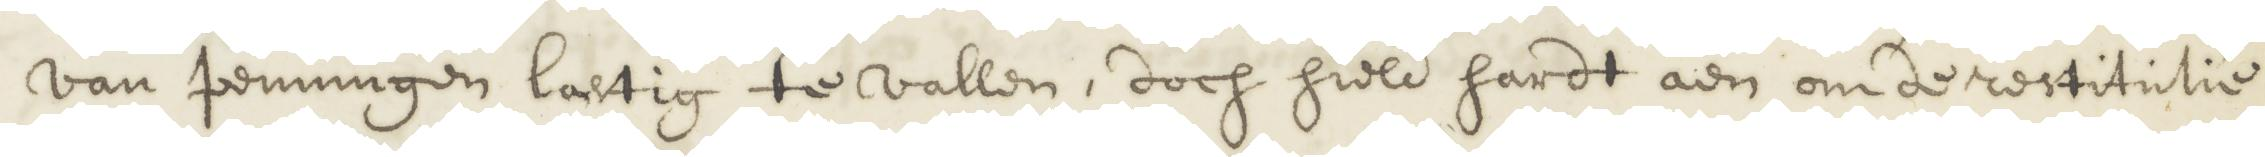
van penningen lastig te vallen, doch hield hardt aen om de restitutie
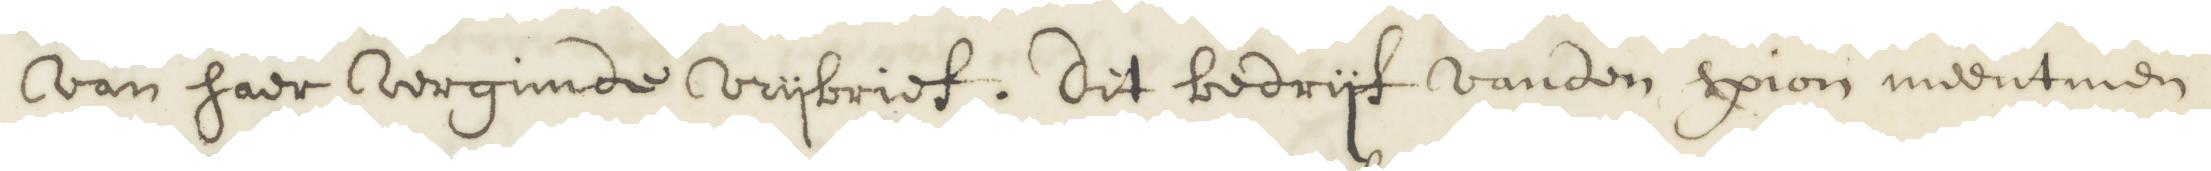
van haer vergunde vrijbrief. Dit bedrijf vanden spion meent men
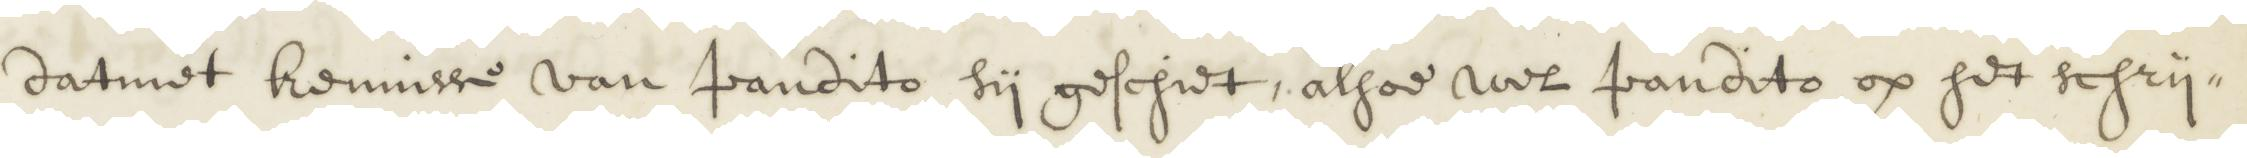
dat met kennisse van pandito sij geschiet, alhoe wel pandito op het schrij„
